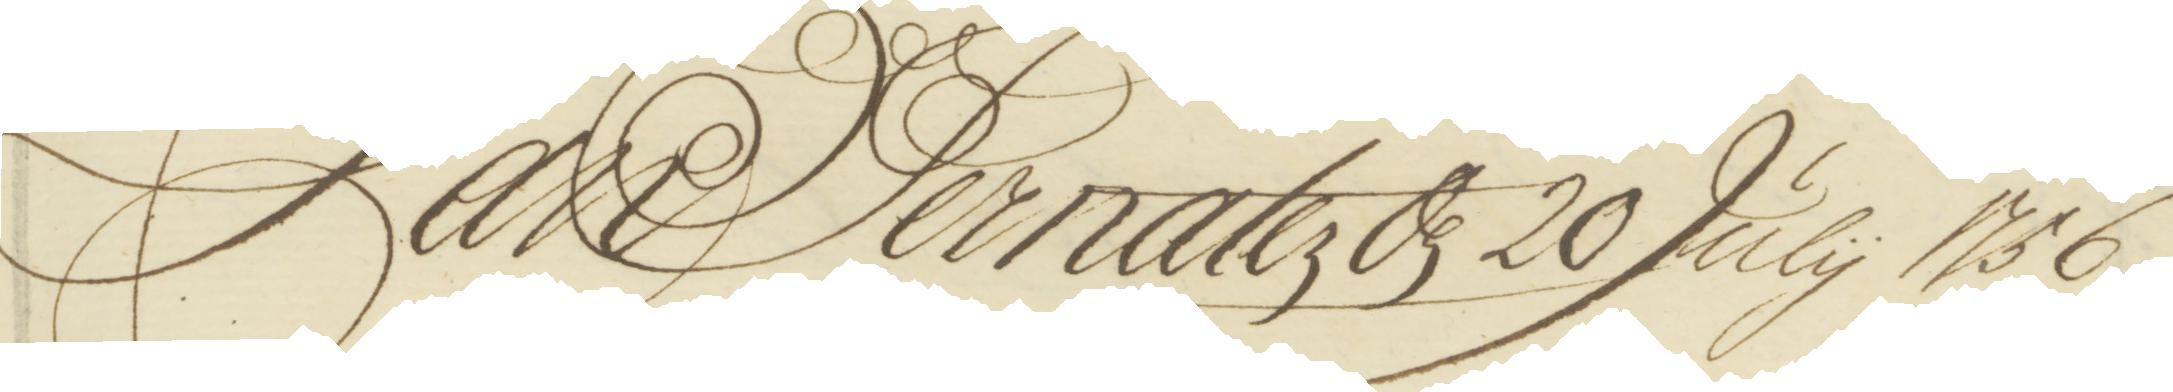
Van Ternaten den 20 Julij 1756
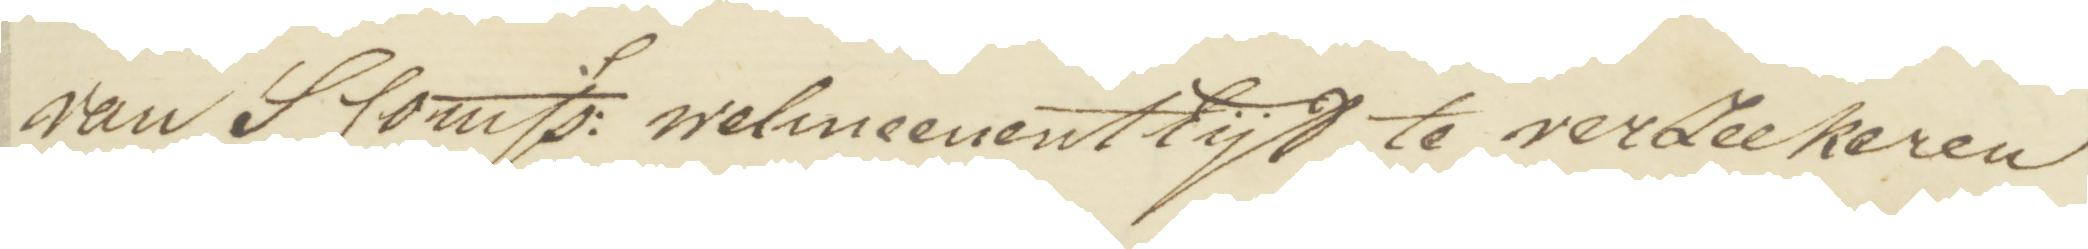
van ’s Comp:s welmeenenthijd te verzeekeren
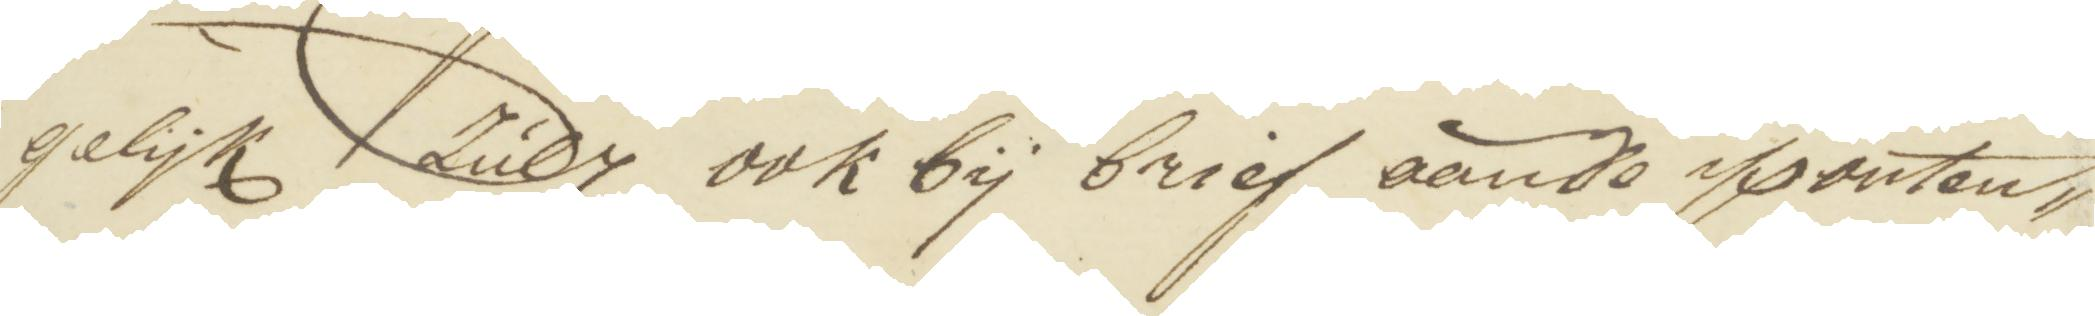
gelijk zulx ook bij brief aande ponten„
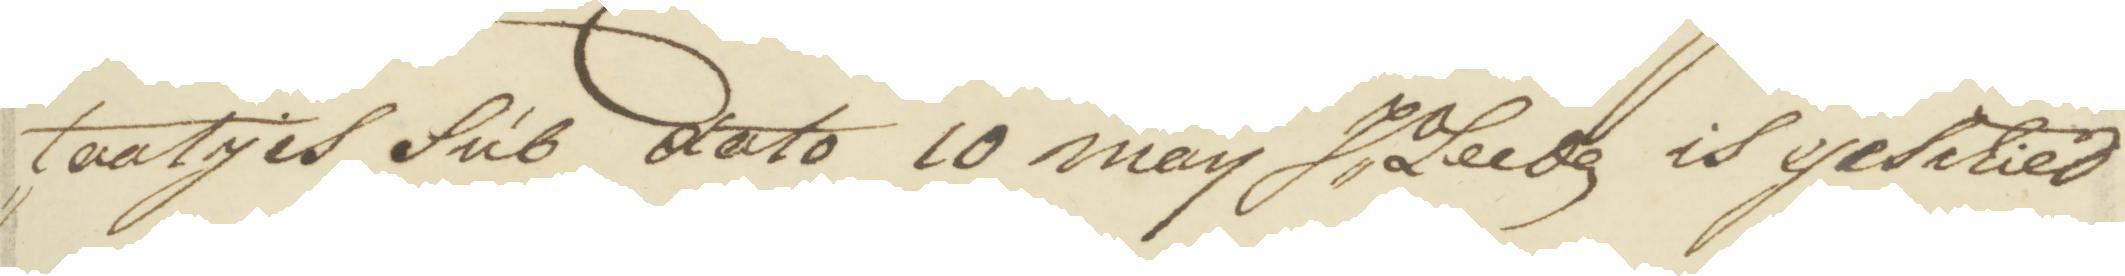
„taatjes sub dato 10 maij J„o Leeden is geschied
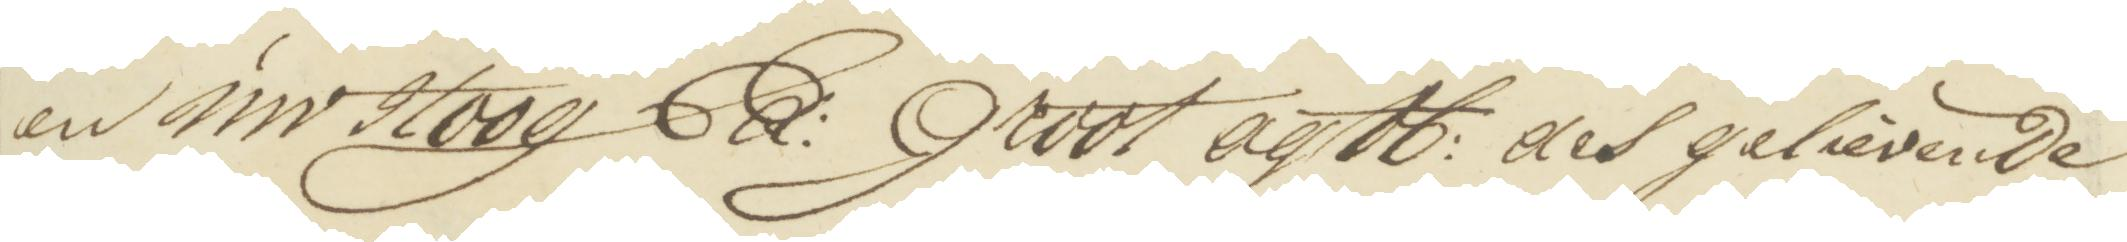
en uw Hoog Ed: Groot agtb: des gelievende
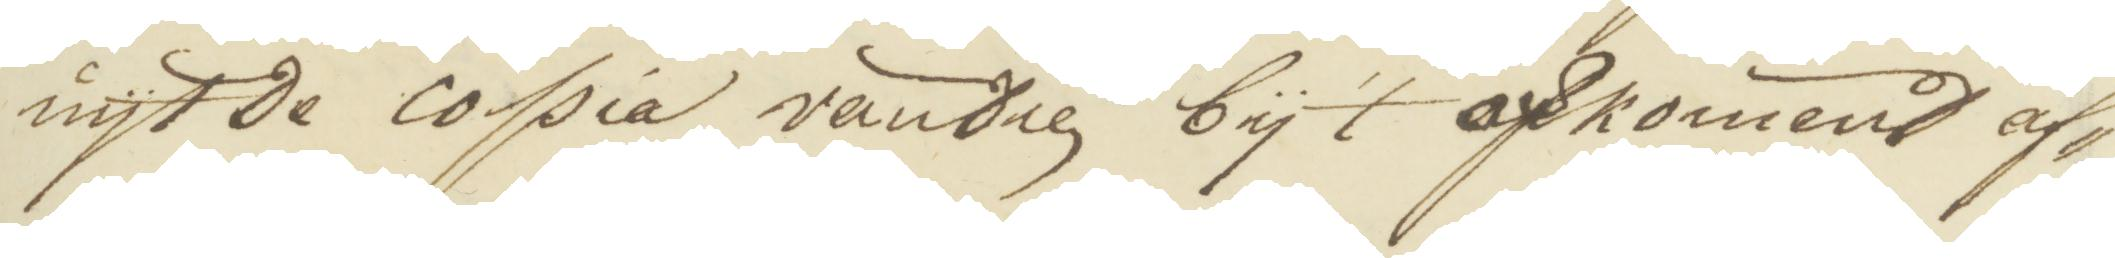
uijt de copia vandien bij ’t overkomend af„
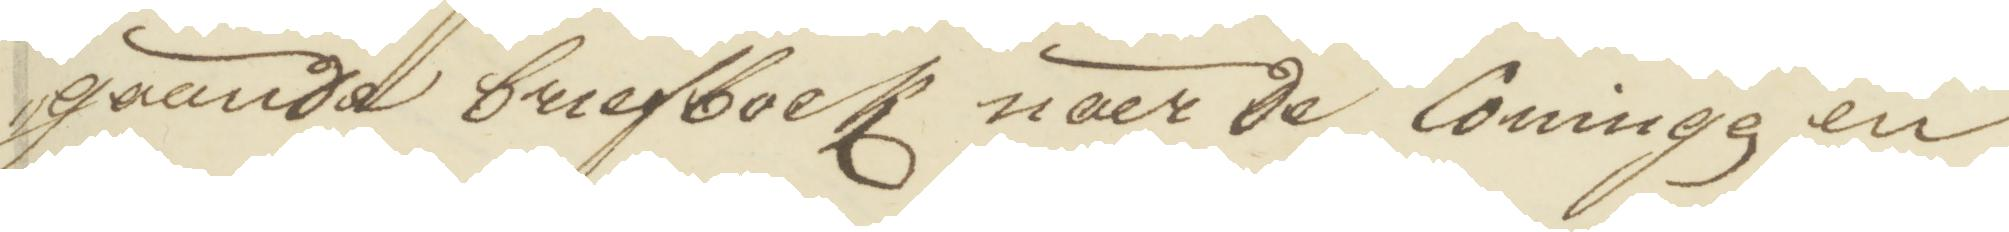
„gaande briefboek naer de Coningen en
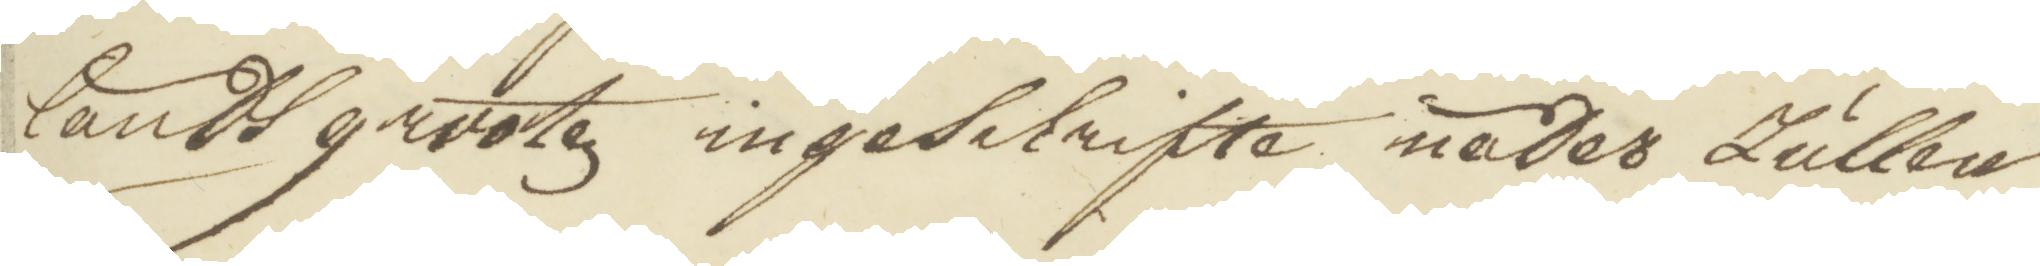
lands grooten ingeschrifte nader zullen
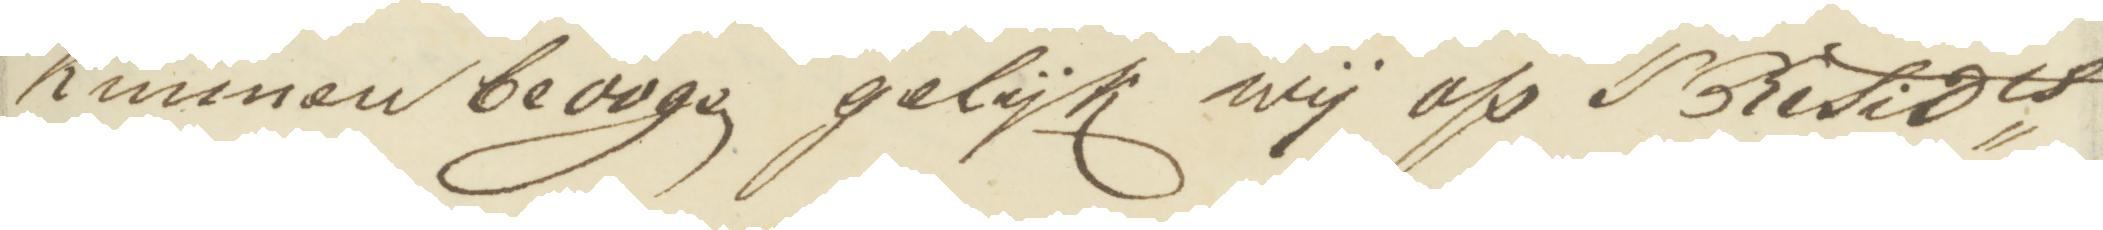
kunnen beoogen gelijk wij op 's Resid„ts
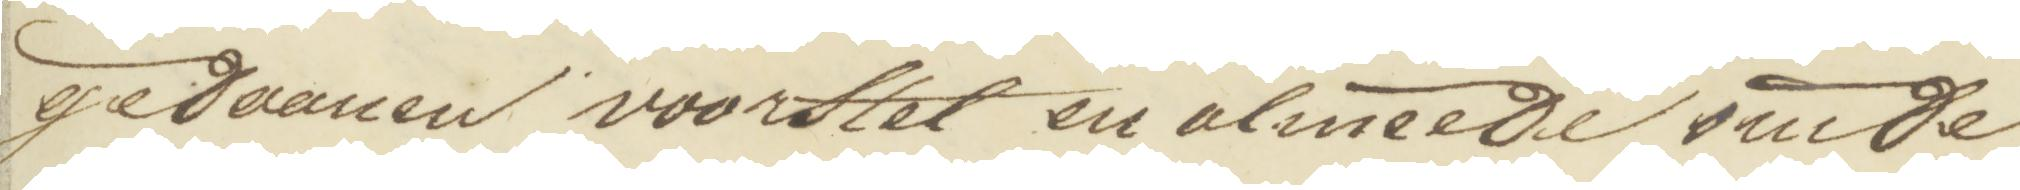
gedaanen voorstel en almeede om de
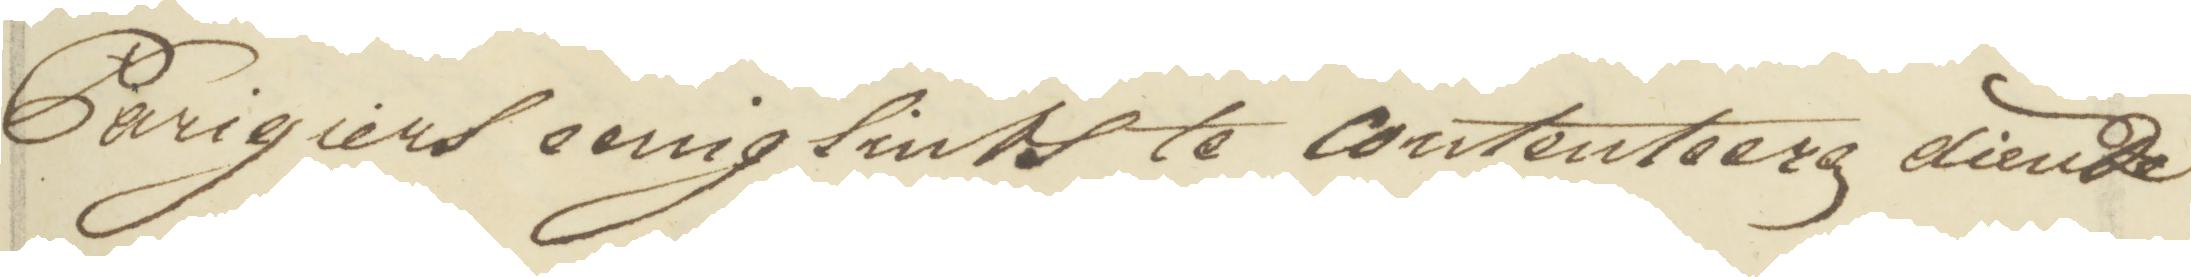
Parigiers eenigsints te contenteeren diende
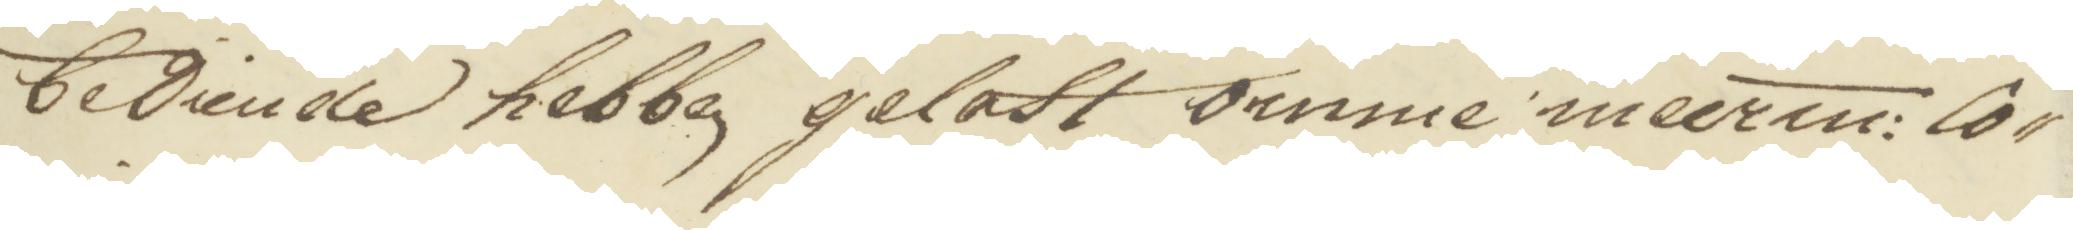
bediende hebben gelast omme meerm: Co„
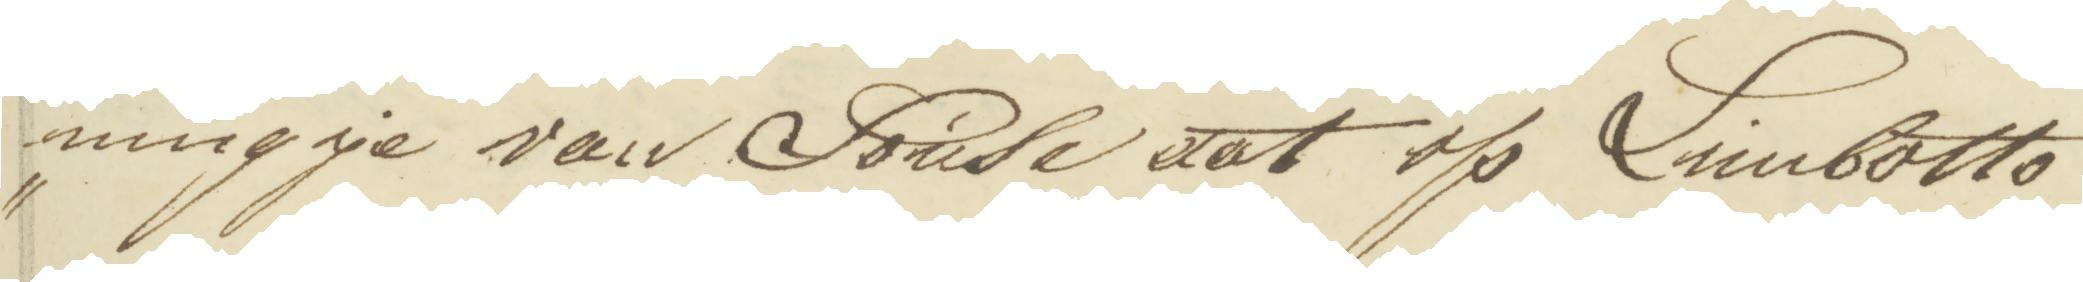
„ningje van Souse dat op Limbotto
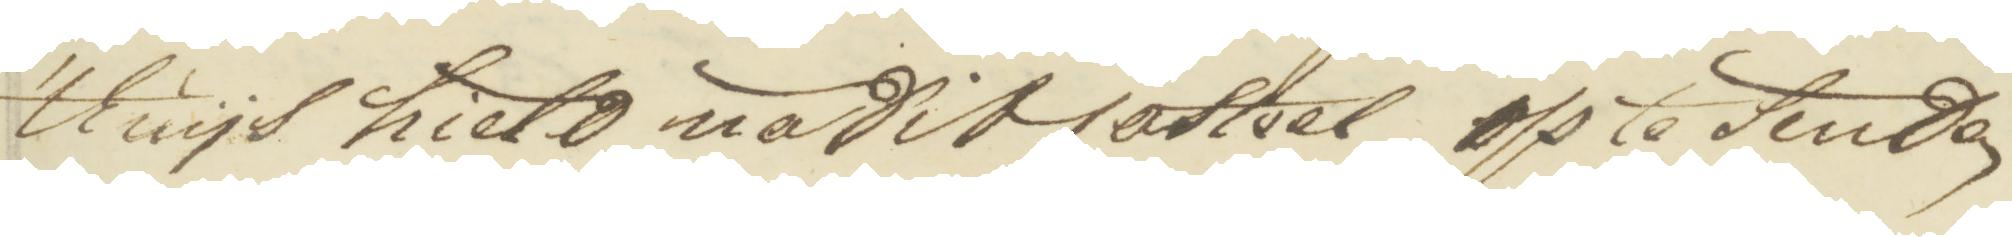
'thuijs hield na dit casteel op te senden
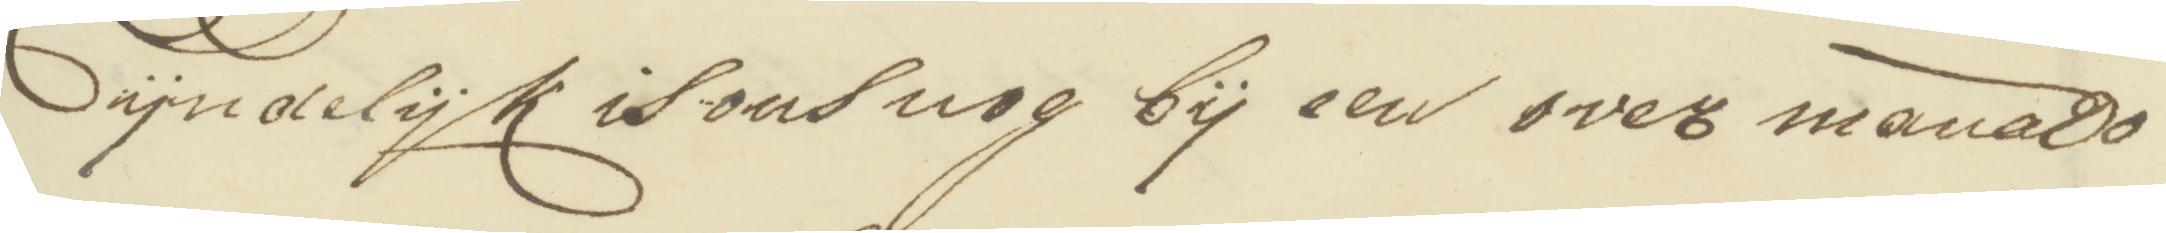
Eijndelijk is ons nog bij een over manado
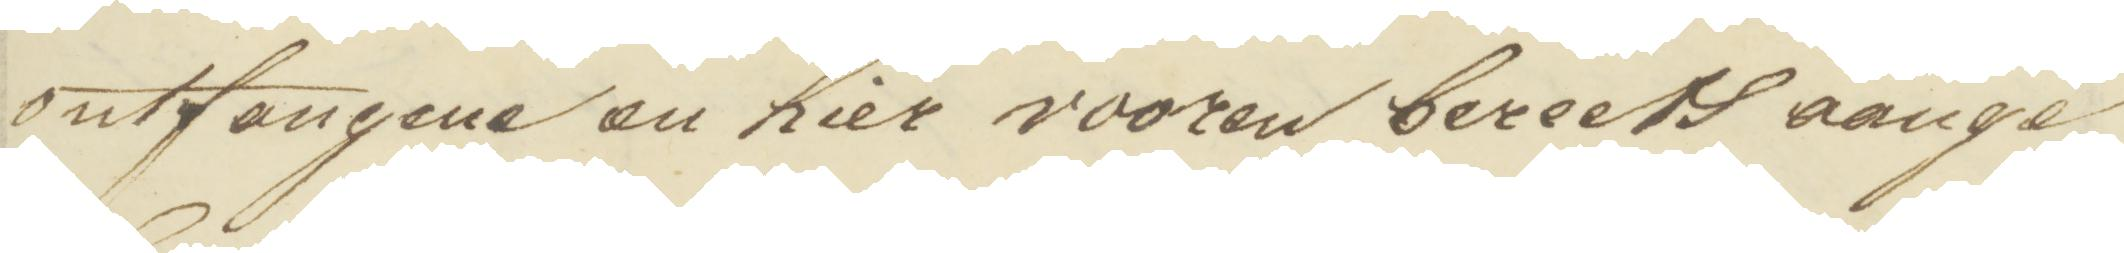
ontfangene en hier vooren bereets aange
